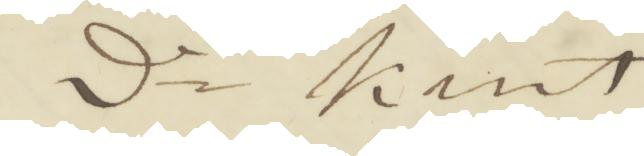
1 _=o kint
